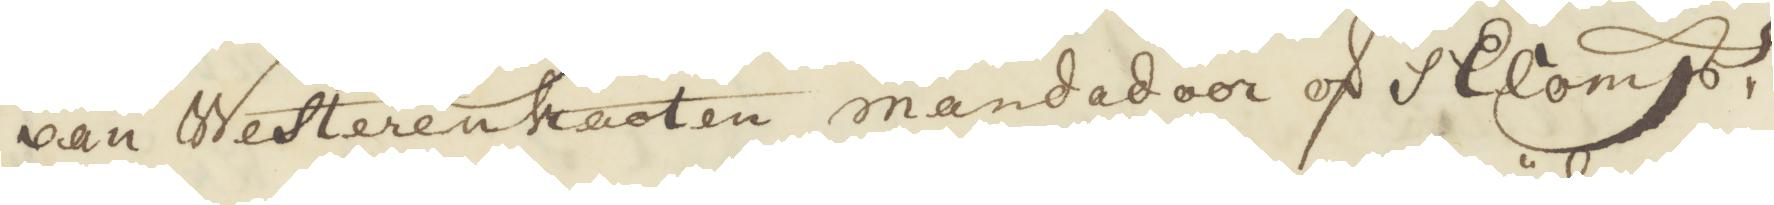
van Westerenkooten mandadoor over ’s E Comp„s
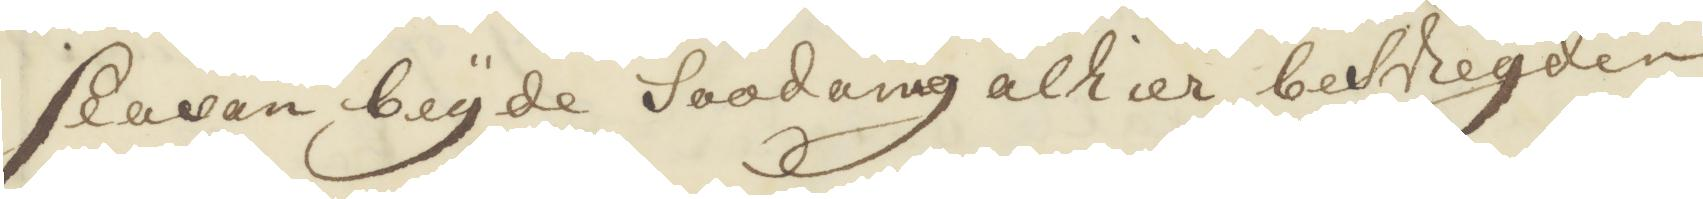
Slaven beijde soodang alhier bescheijden
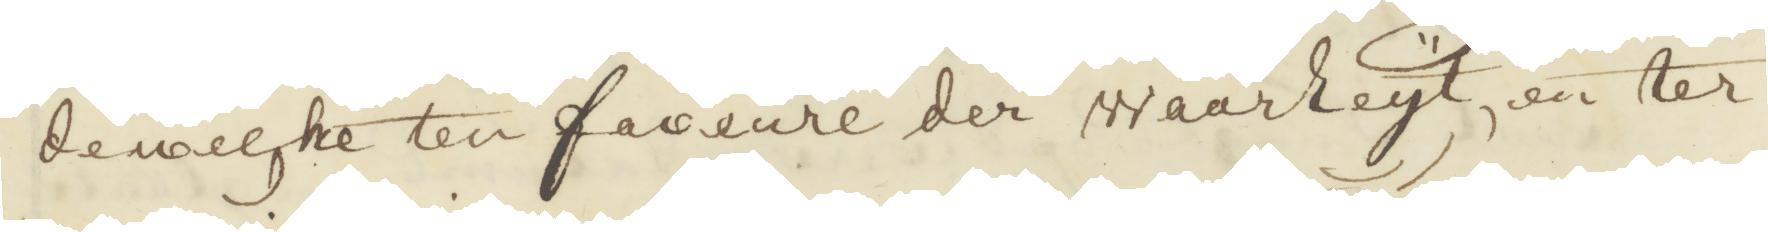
dewelke ten faveure der waarheijt, en ter
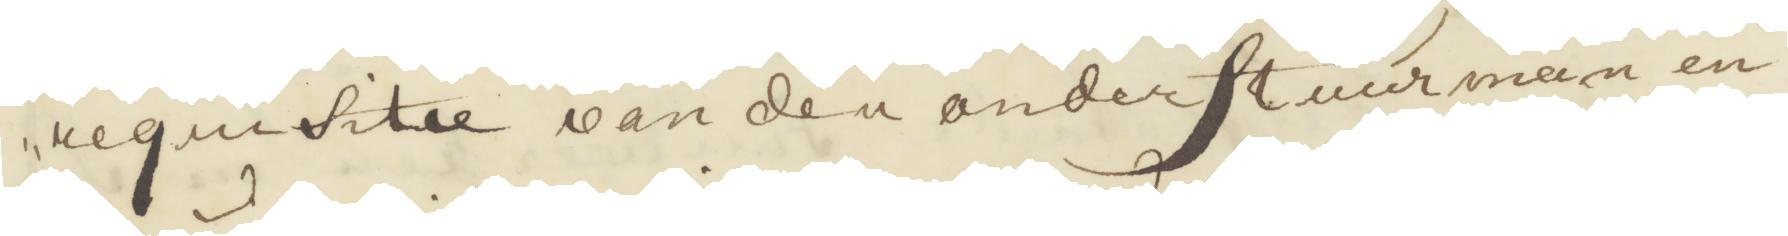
„requisitie van den onderstuurman en
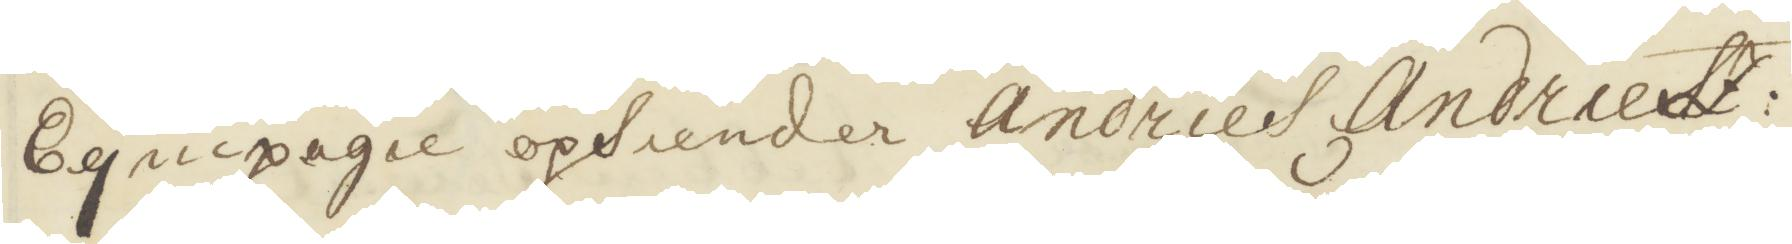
Equipagie opsiender Andries Andriesz:
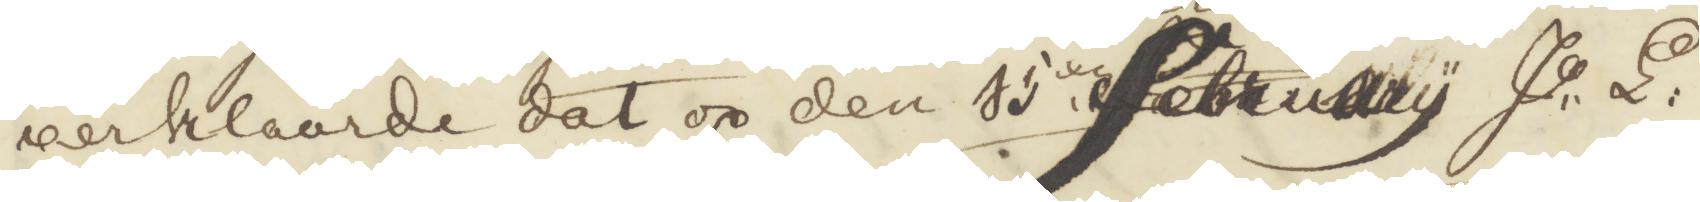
verklaarde dat op den 15:en Februarij J„o L:
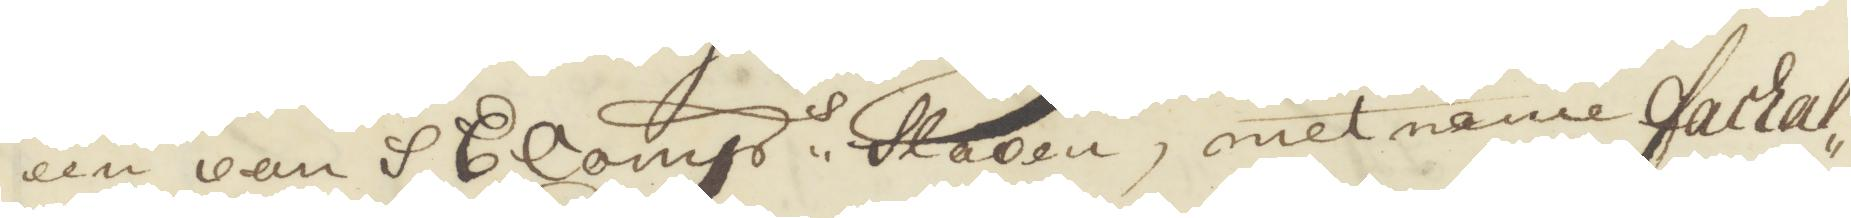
een van ’s E Comp„s slaven, met name fachal„
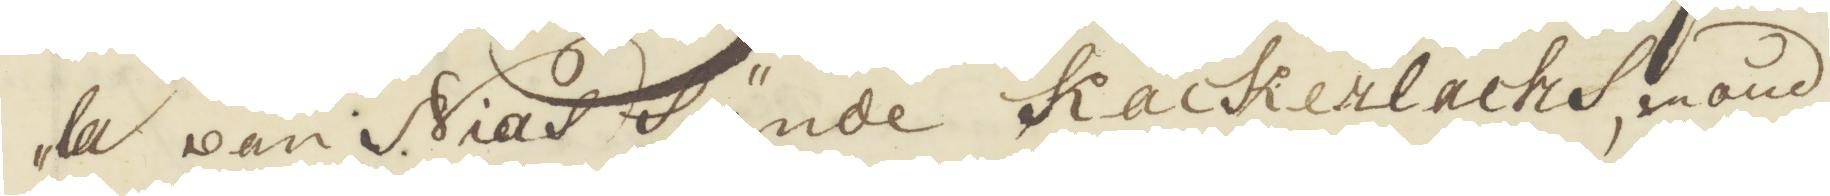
„la van Nias sijnde kackerlacks, en oud
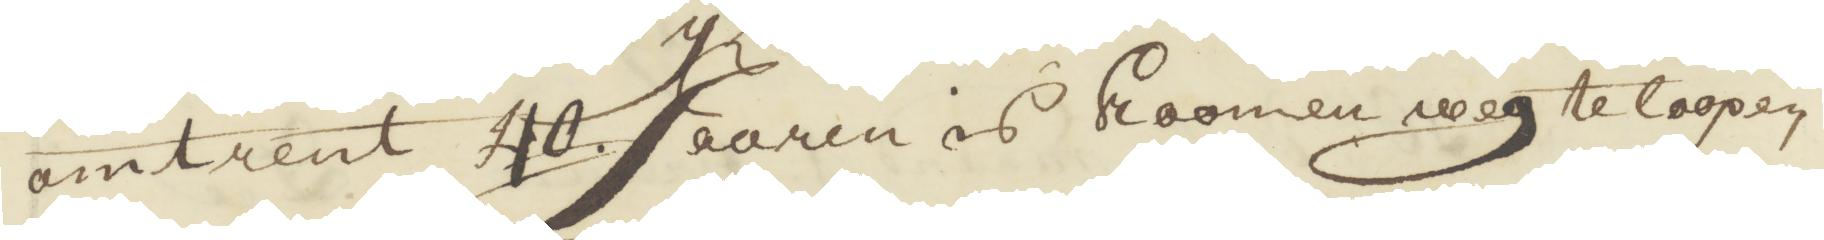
omtrent 40. Jaaren is koomen weg te loopen
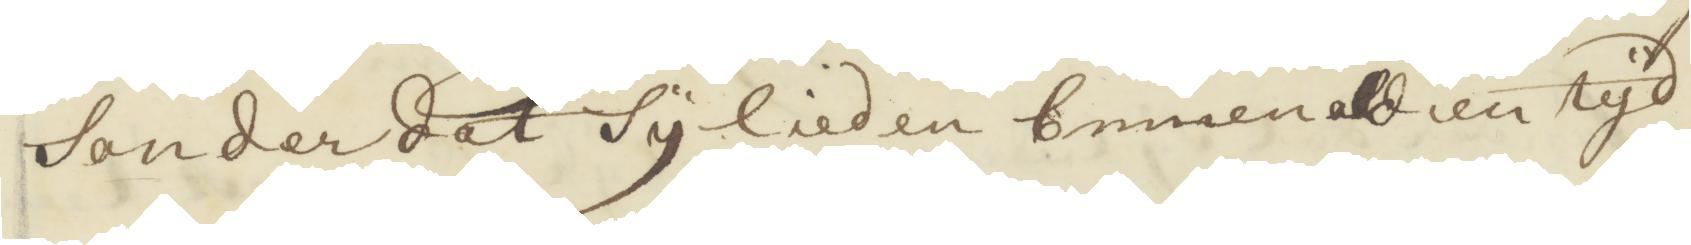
sonder dat sij lieden binnen aldien tijd
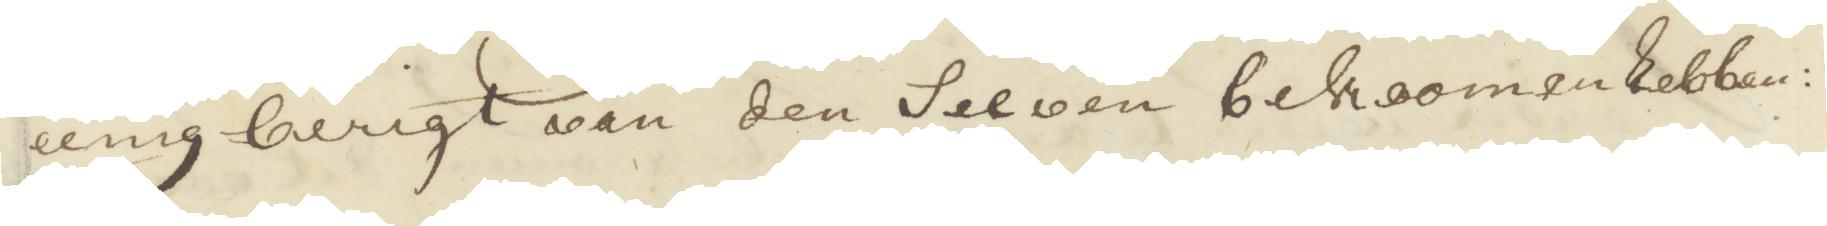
eenig berigt van den selven bekoomen hebben:
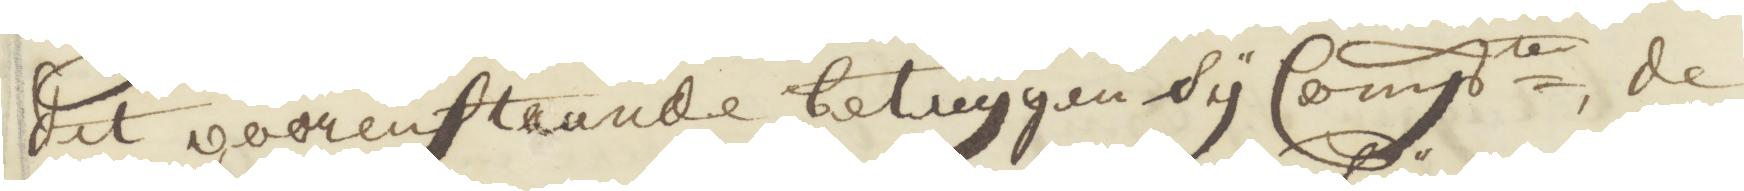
dit voorenstaande betuijge sij Comp=te, de
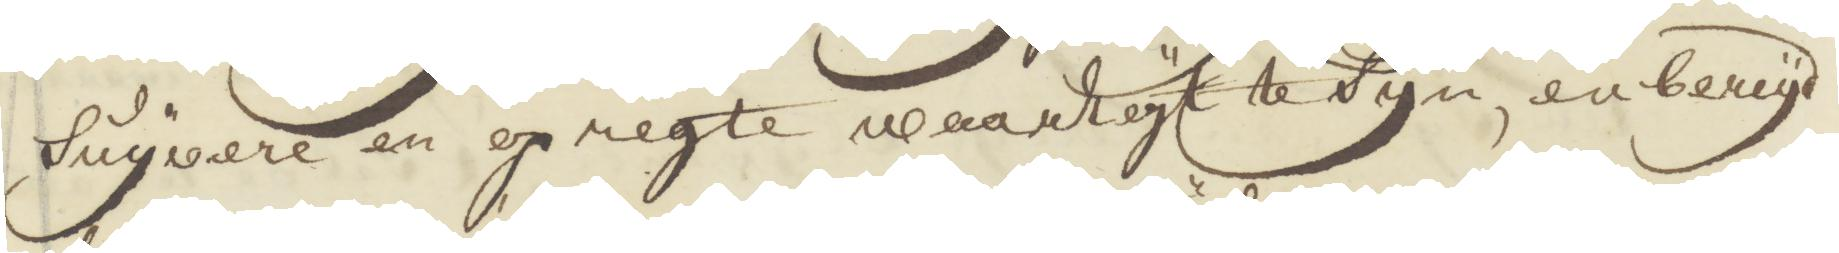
suijvere en op regte waarheijt te sijn, en bereijd
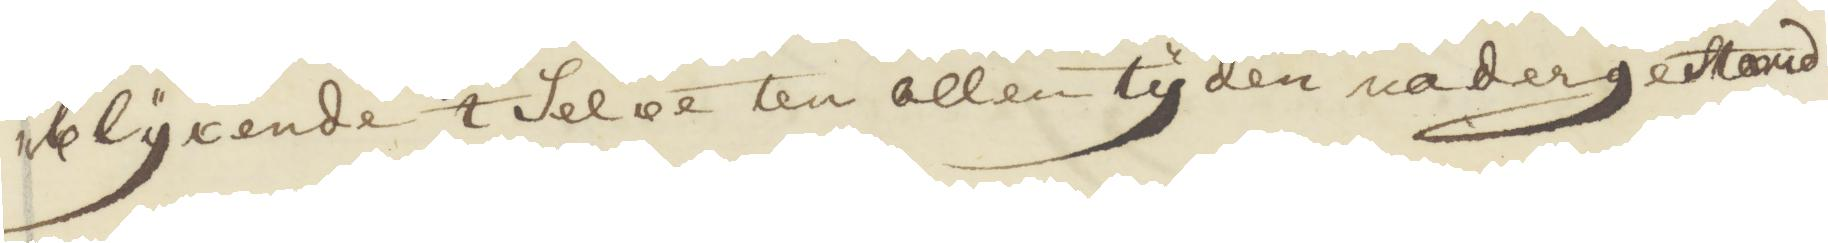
blijvende ’t selve ten allen tijden nader gestand
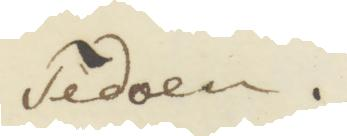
Tedoen.
